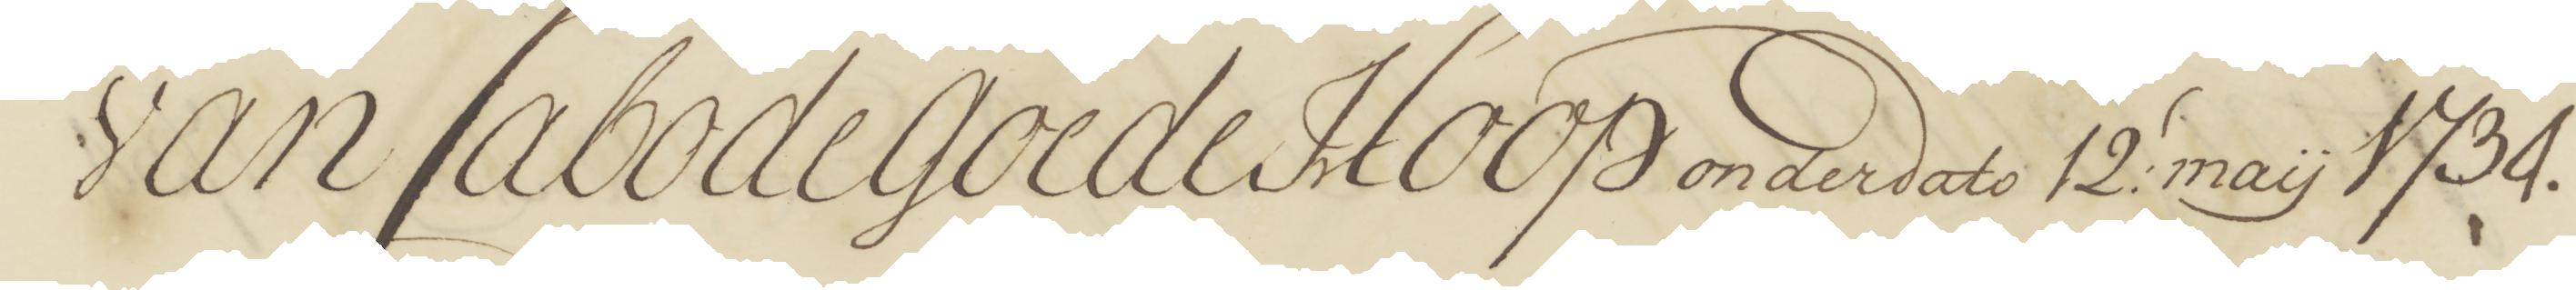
Van Cabo de goede Hoop onder dato 12:' maij 1734.
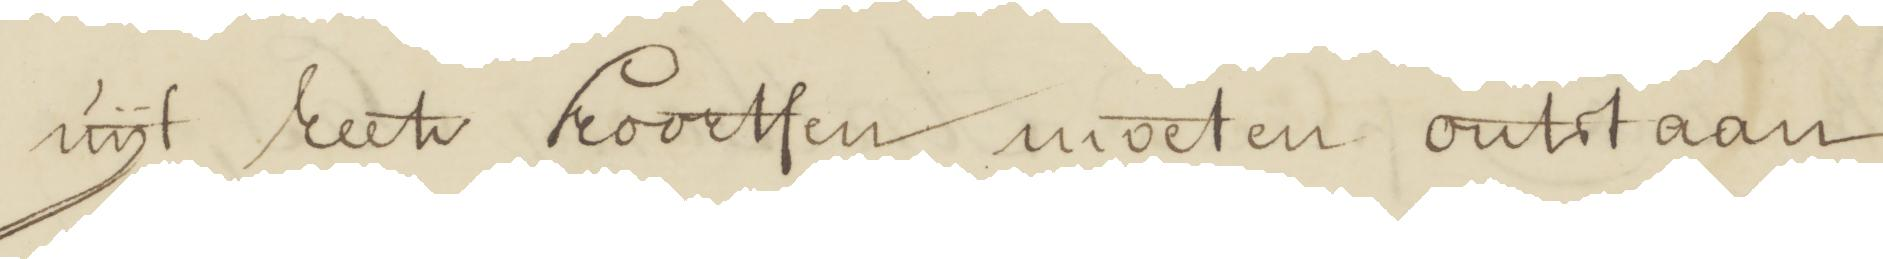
uijt heete koortsen moeten ontstaan
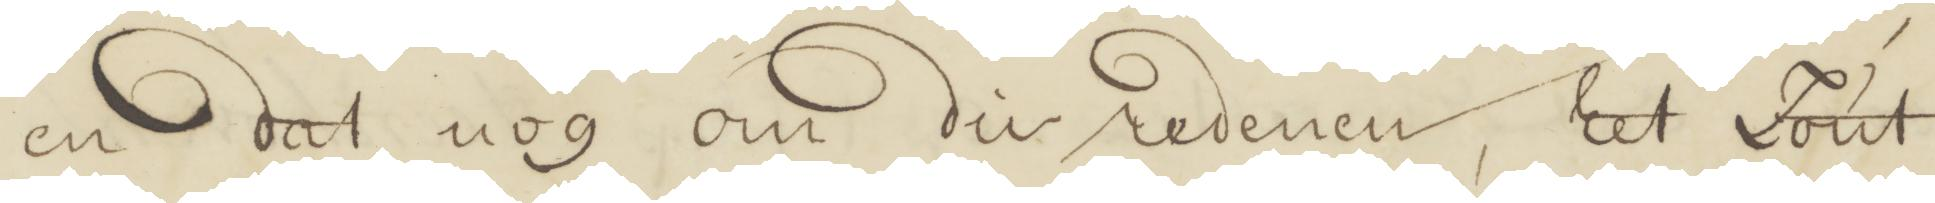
en dat nog om die redenen, het zout
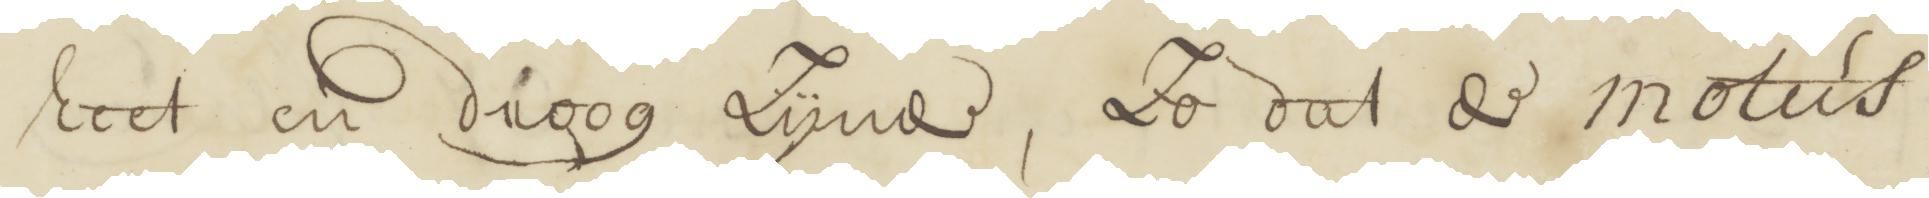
heet en droog zijnde, zo dat de motus
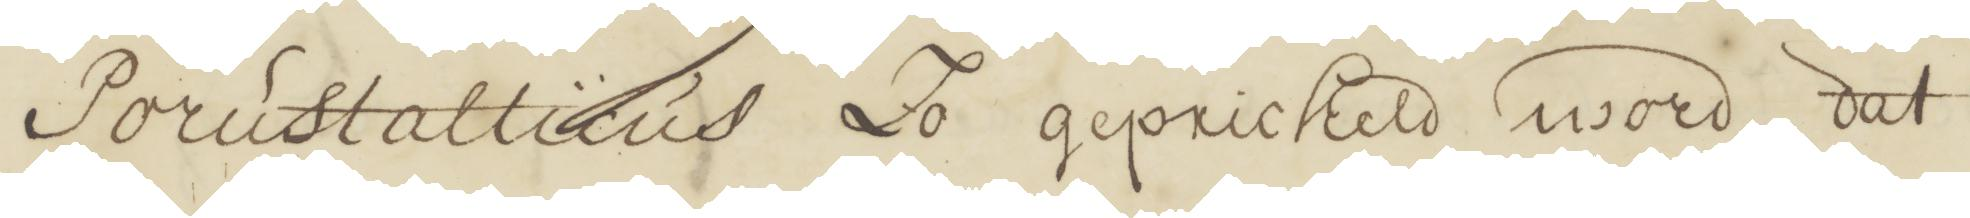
Porustalticus zo geprickeld word, dat
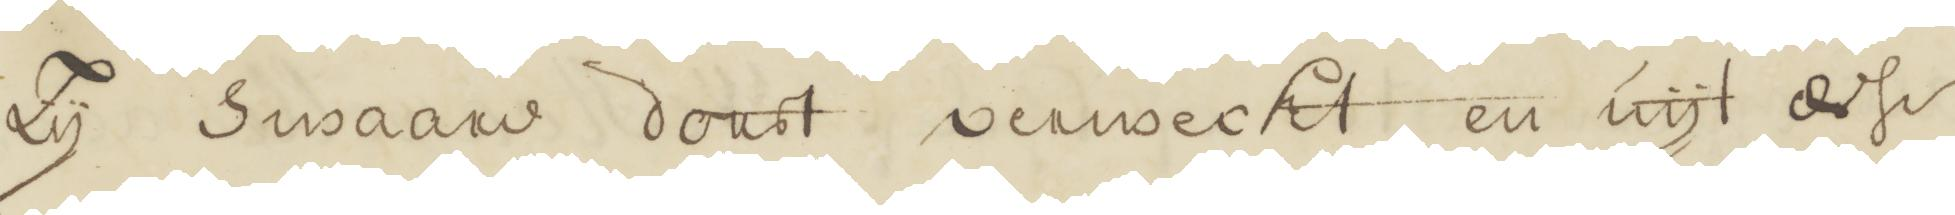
zij swaare dorst verweckt, en uijt dese
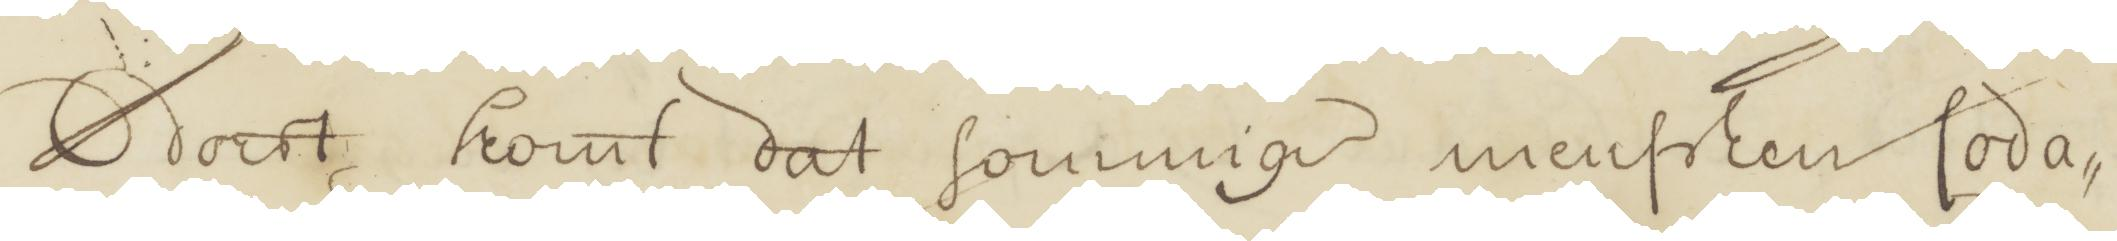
dorst komt dat sommige menschen soda„
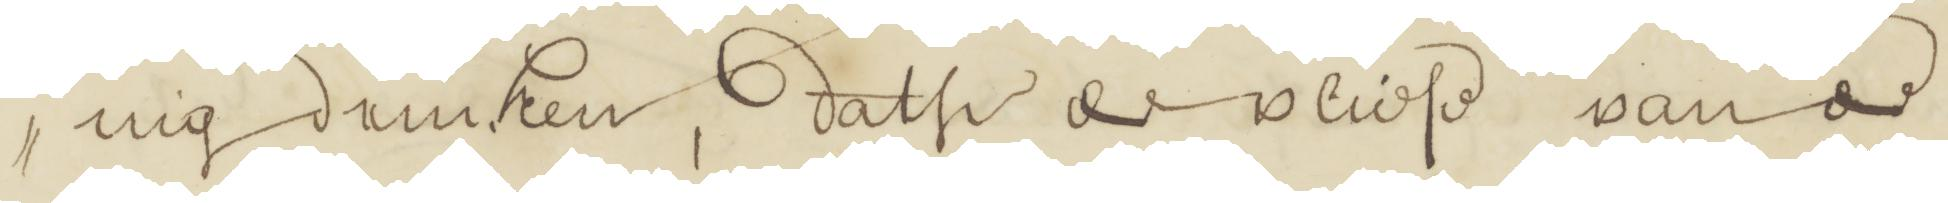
„nig drinken, datse de vliese van de
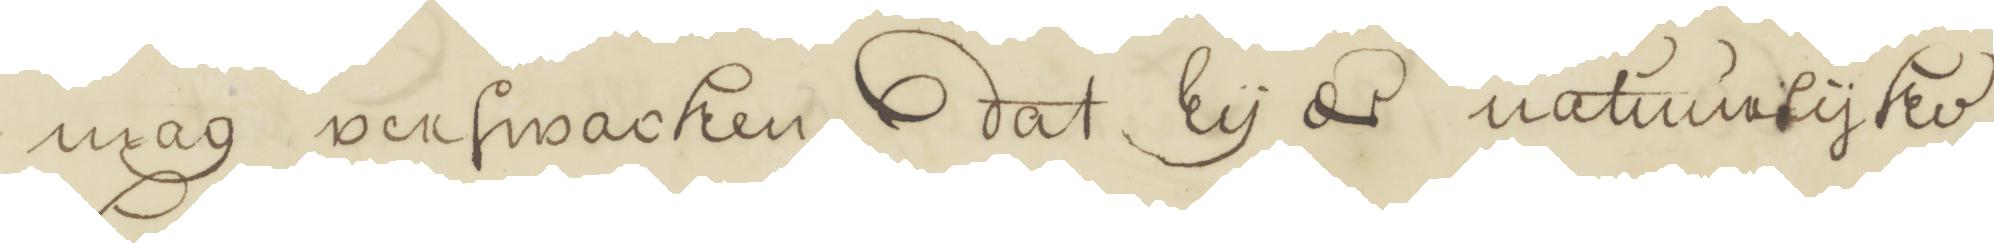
mag verswacken, dat hij de natuurlijke
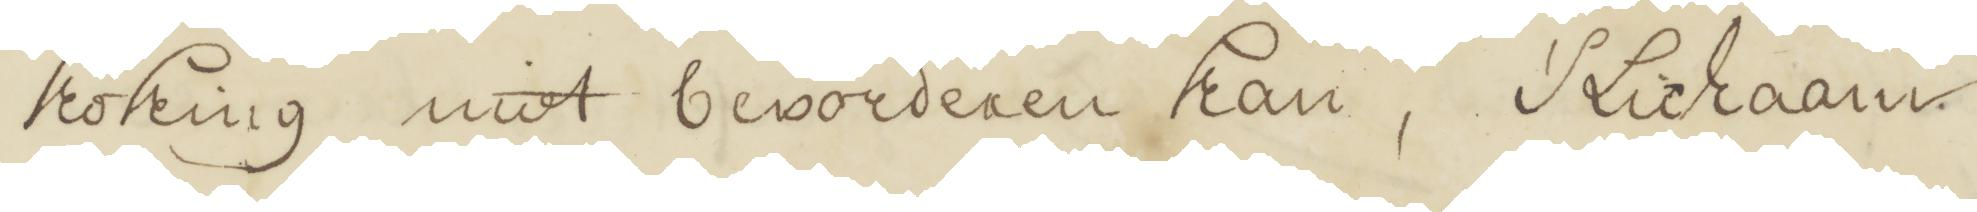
koking niet bevorderen kan, 's Lichaam
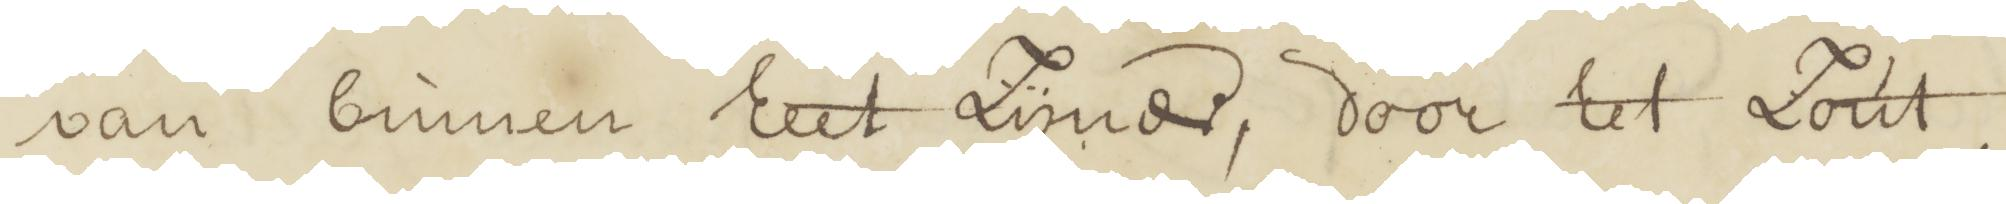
van binnen heet zijnde, door het zout,
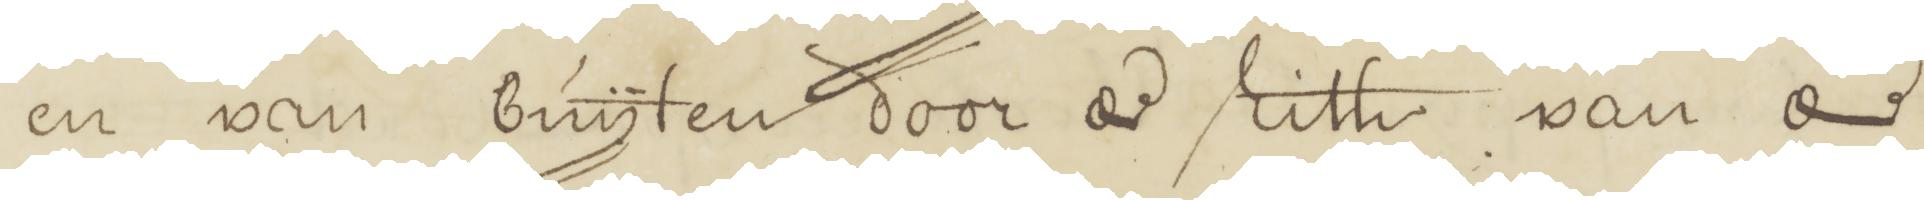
en van buijten door de hitte van de
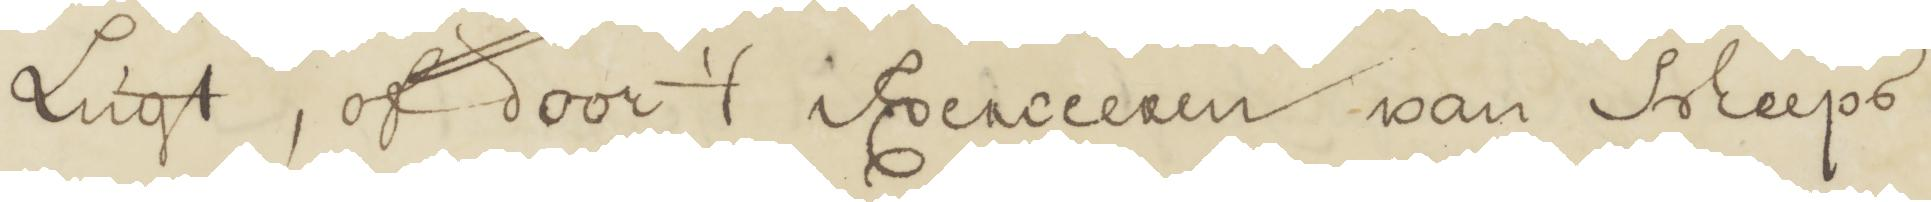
Lugt, of door ’t Exerceeren van scheeps
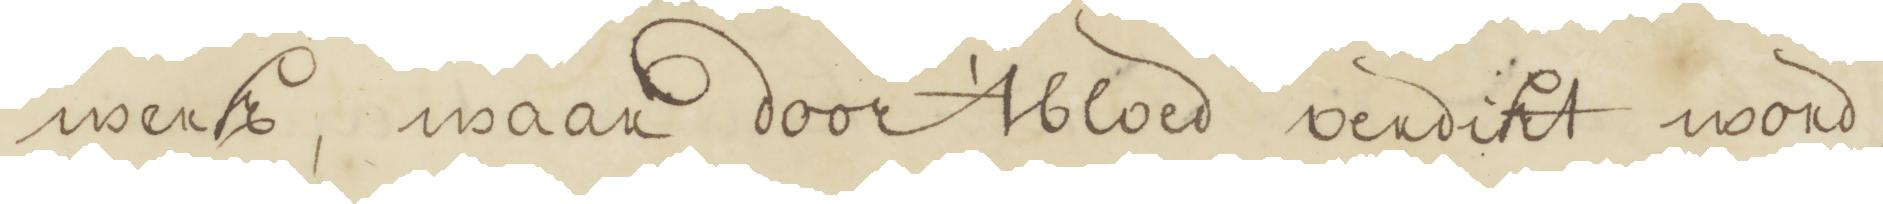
werk, waar door ’tbloed verdikt word
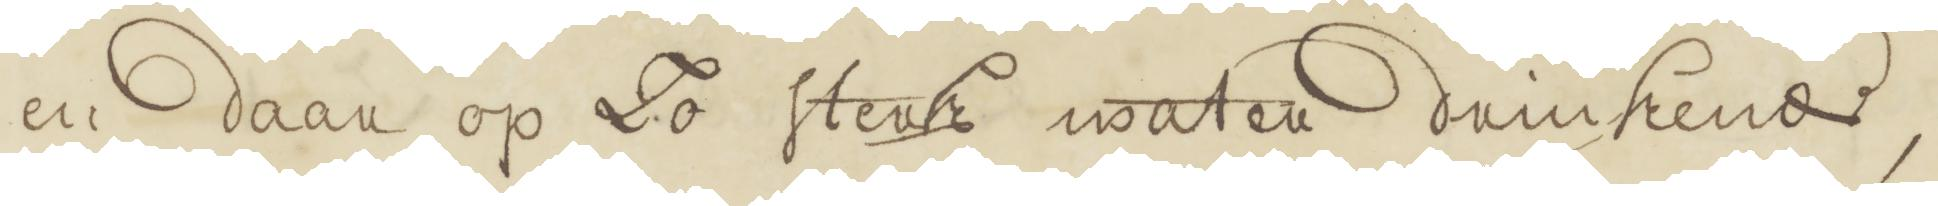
en daar op zo sterk water drinkende,
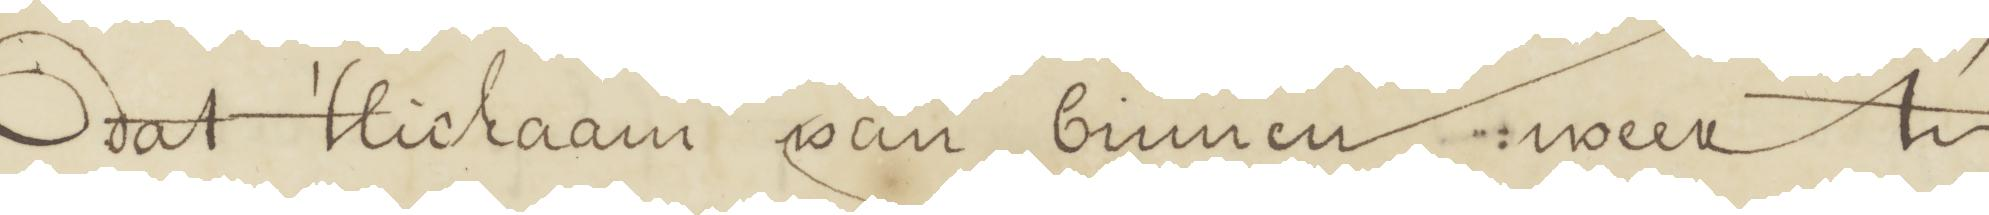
dat 'tlichaam van binnen weer te
